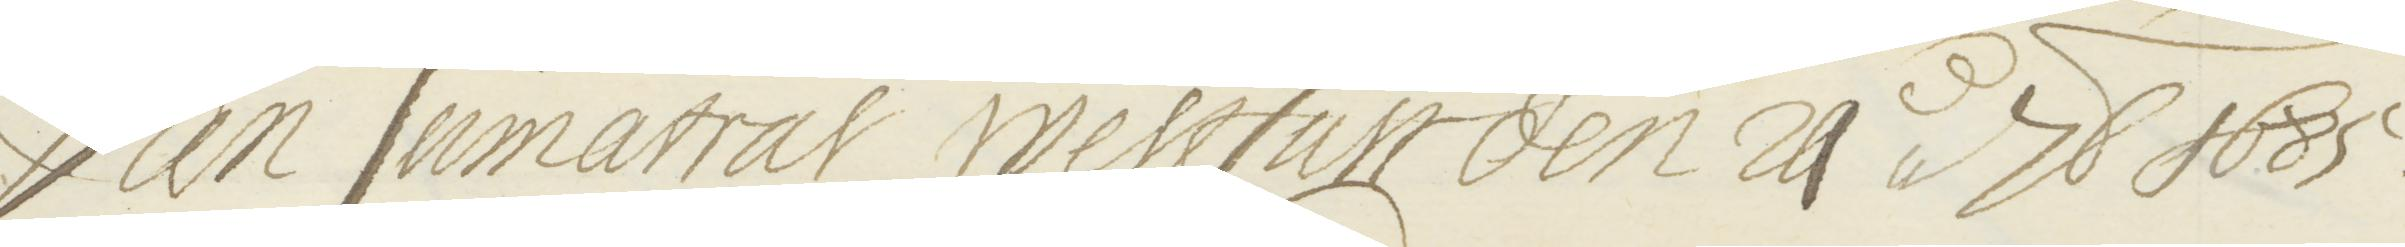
Van Sumatras west Cust den 24„e 7b 1685.
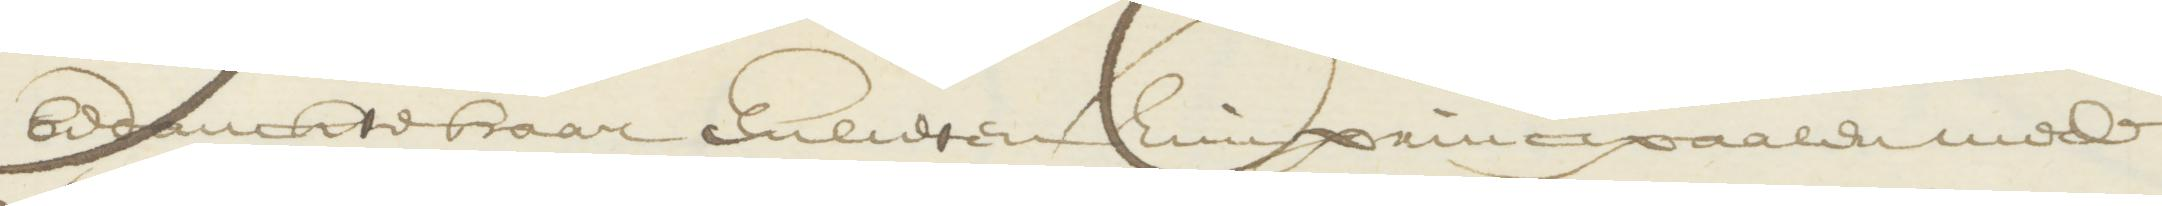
bedanckte haar En lieten hun principaalen mede
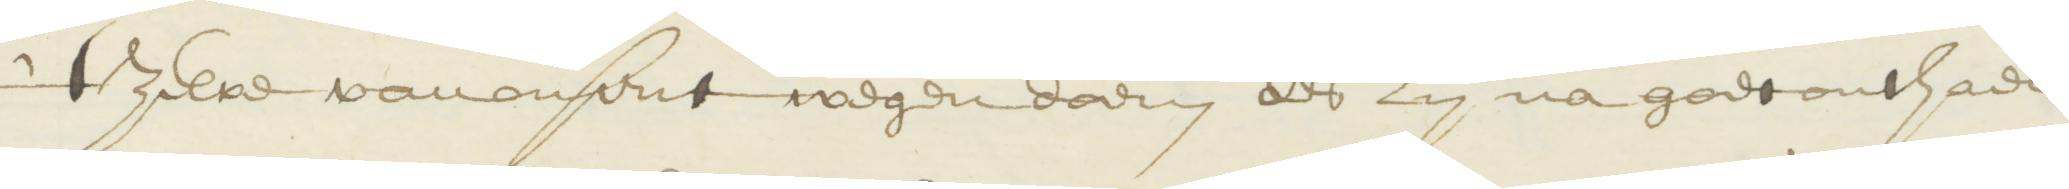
't zelve van onsent wegen doen des zij na goet onthael
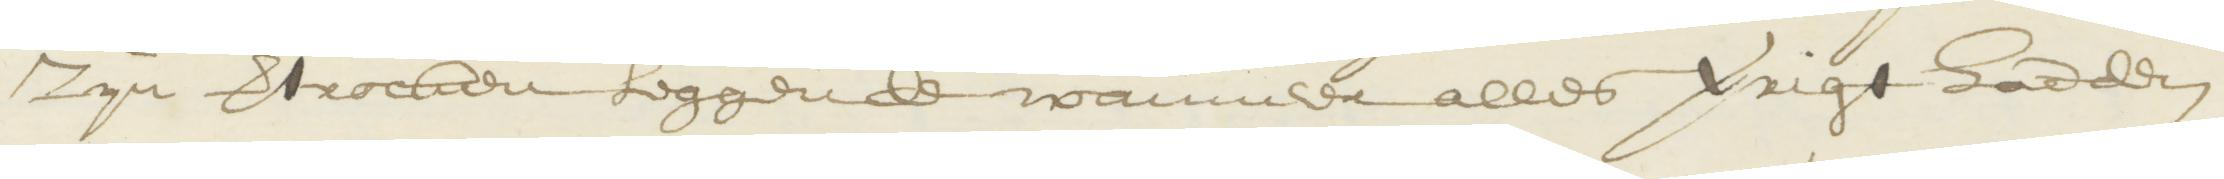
zijn vertrocken seggende wanneer alles verrigt hadden
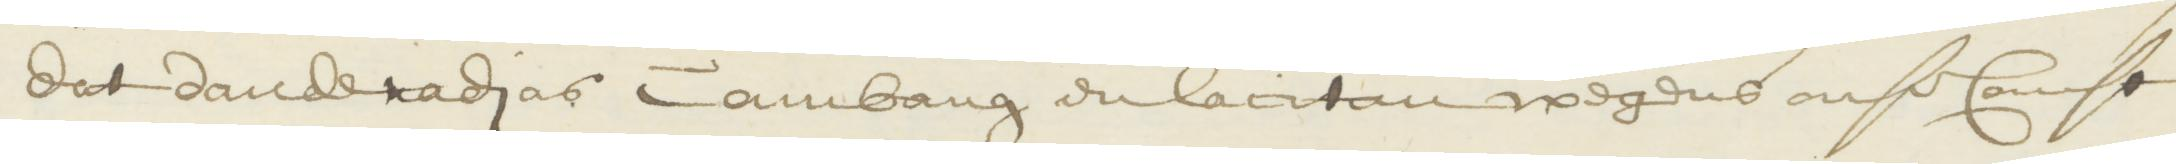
dat dan de radjas Cambang en lacitan wegens onse Compt
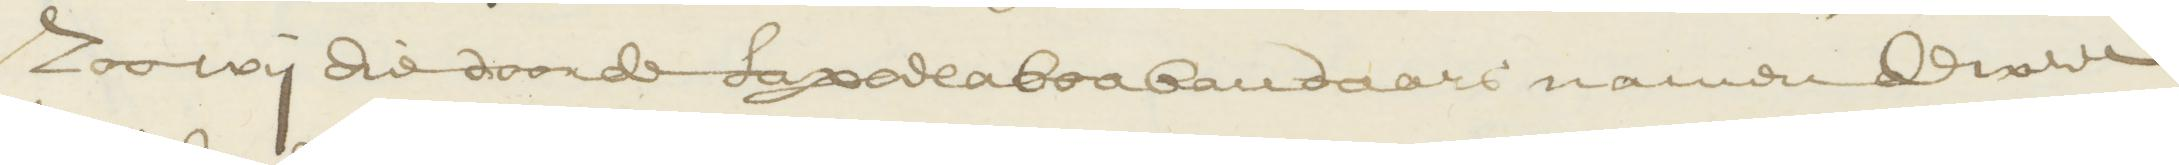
zoo wij die door de sapoelaboabandaars namen de weet
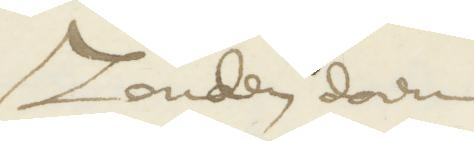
zouden doen
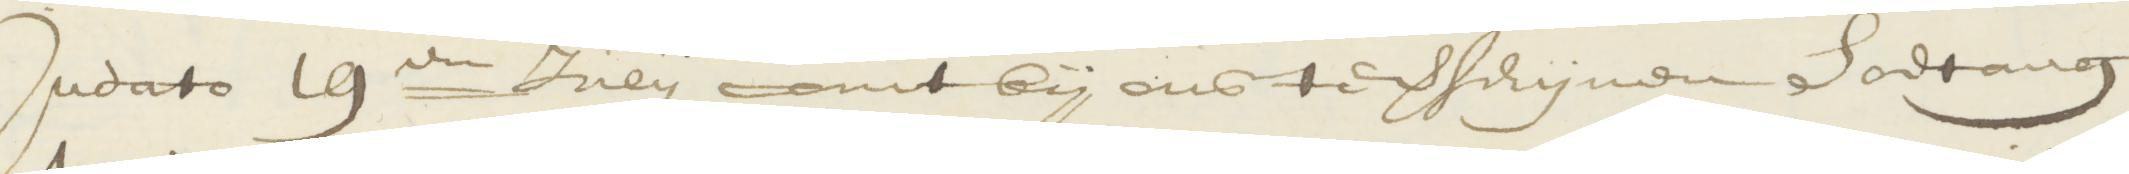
Jndato 19=en Julij comt bij ons te verschijnen Soetang
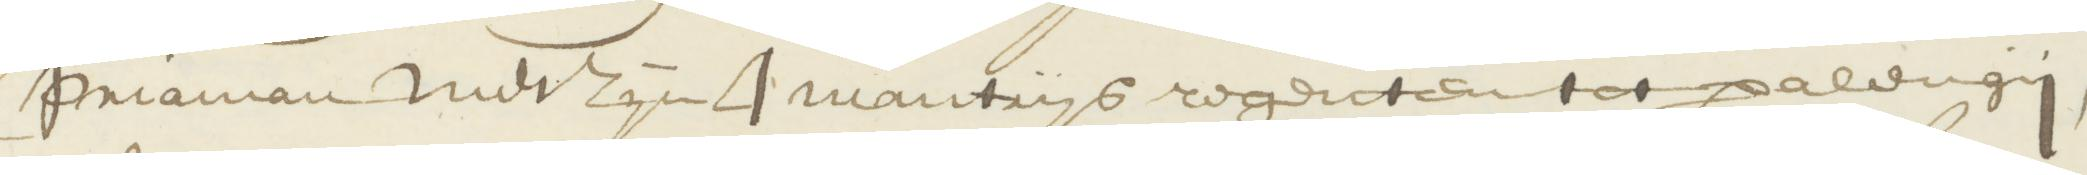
priaman met zijn 4 mantrijs regenten tot palengij,
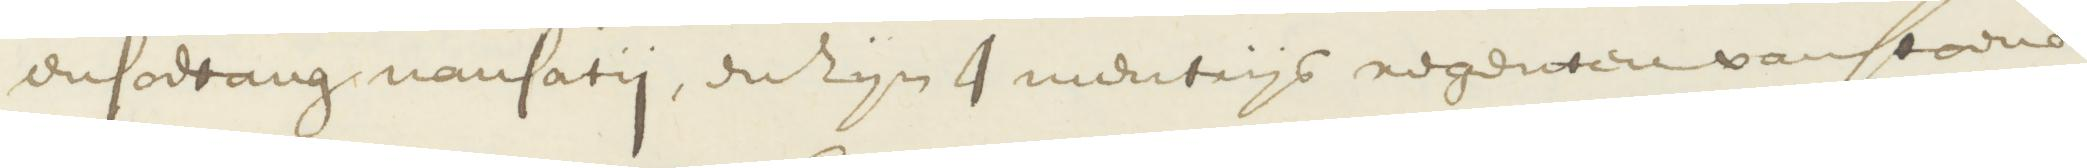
en soetang nansatij, en zijn 4 mentrijs regenten van stoeno
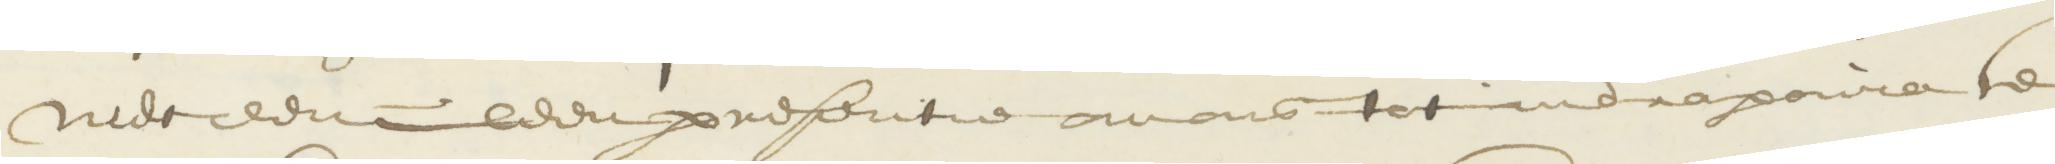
met een cleen presentie om ons tot indrapoura te
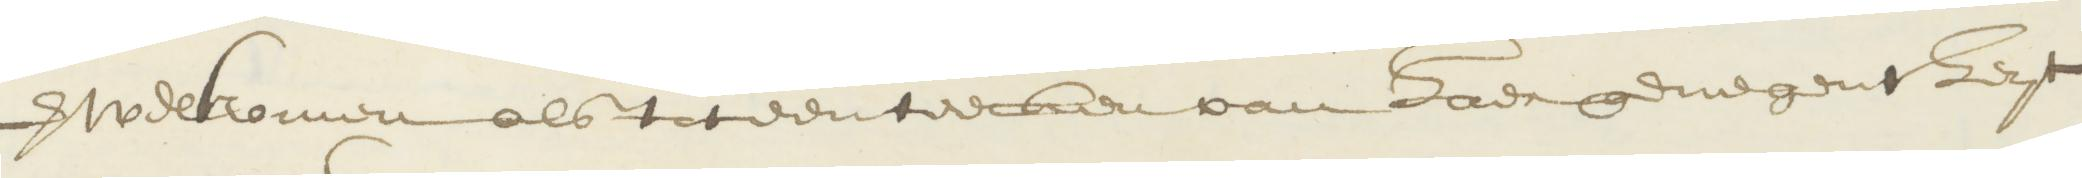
verwelkomen als tot een teecken van haer genegentheyt,
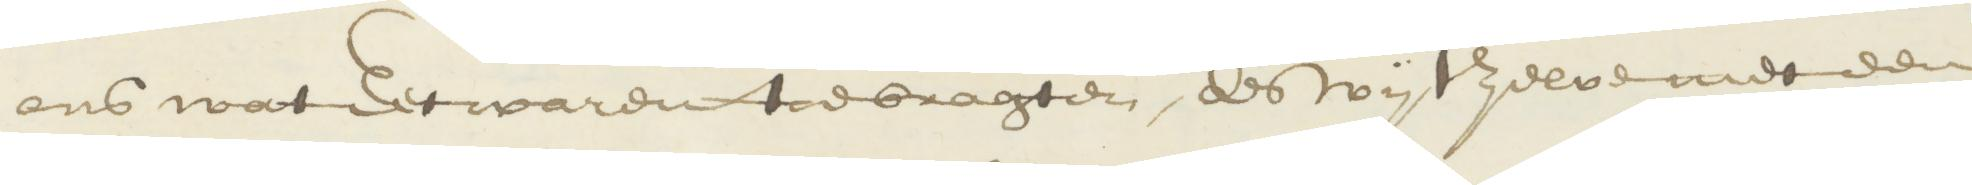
ons wat Eetwaren toebragten, des wij tzelve met een
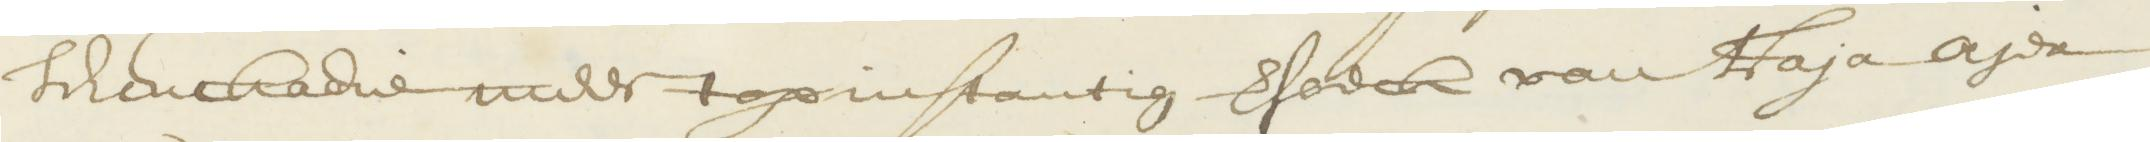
schenckadie meest op instantig versoeck van Waja ajer
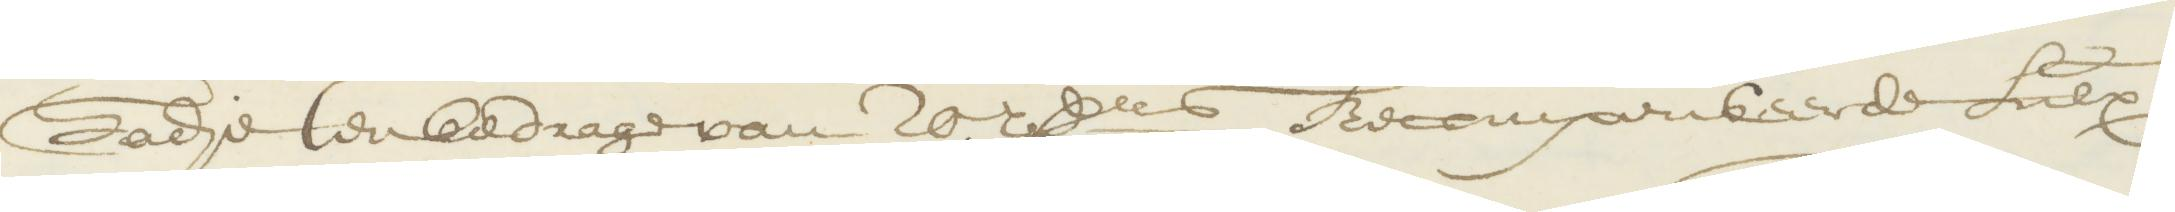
hadje ten bedrage van 20. rx=les Recompenseerde sulx
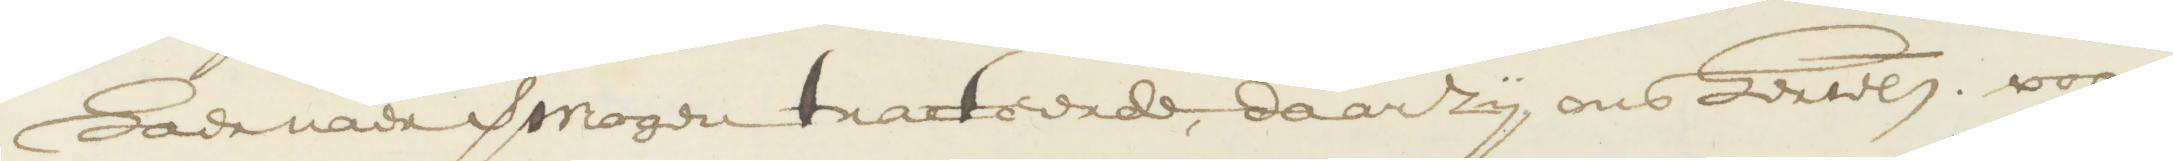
haer naer vermogen tracteerde, daarzij ons hertelijk voor
